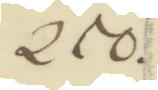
250.
